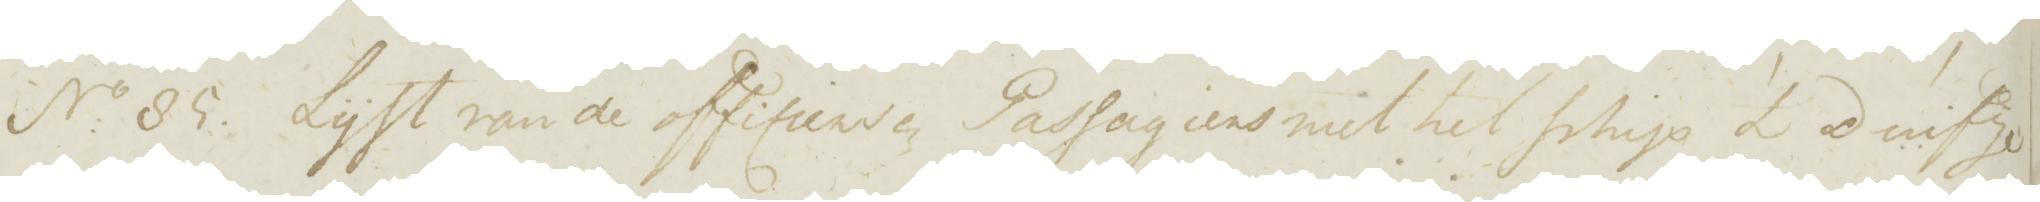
N:o 85. Lijst van de officiers en Passagiers met het schip 't duifje
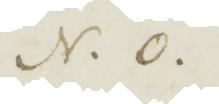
N. O.
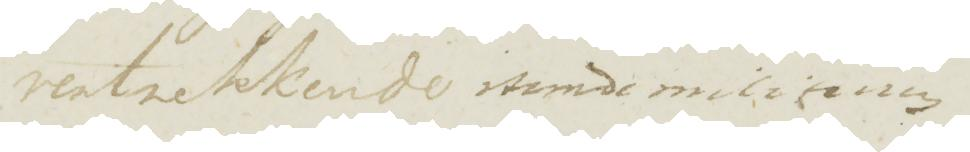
vertrekkende item de militairen
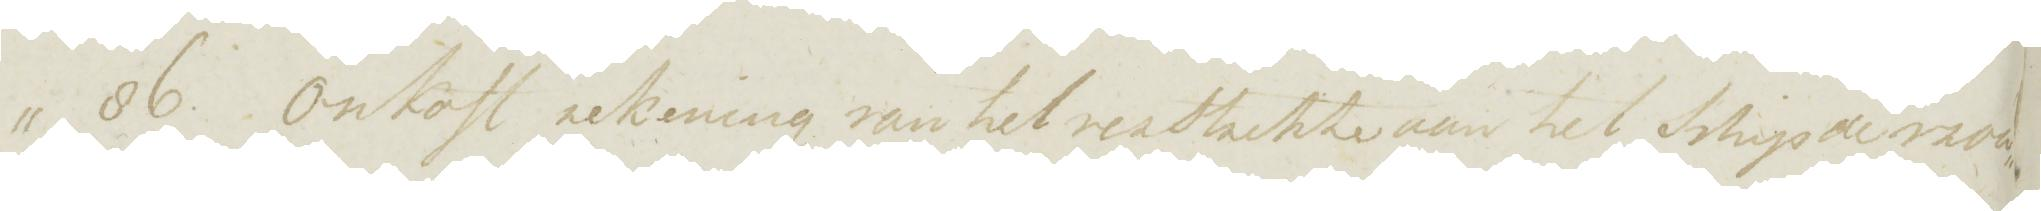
„ 86 Onkost rekening van het verstrekte aan het Schip de vrou„
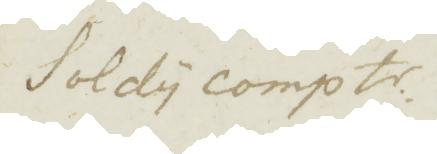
soldij comptr.
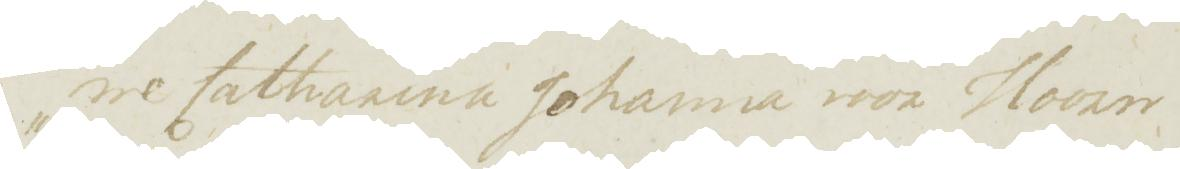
„ we Catharina Johanna voor Hoorn.
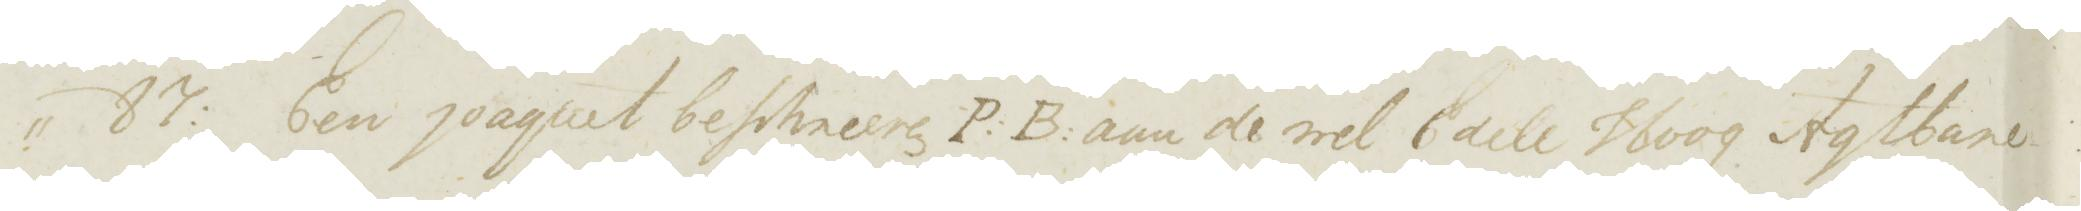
„ 87: Een paquet beschreeven P: B: aan de wel Edele Hoog Agtbare
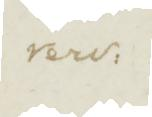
verv„
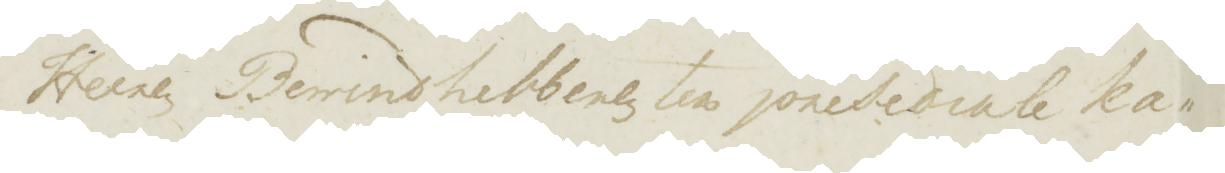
Heeren Bewindhebberen ter presediale ka„
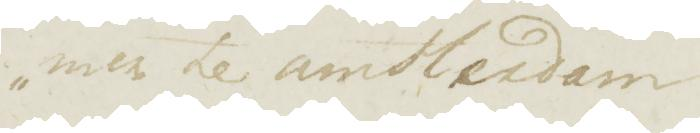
„mer te amsterdam
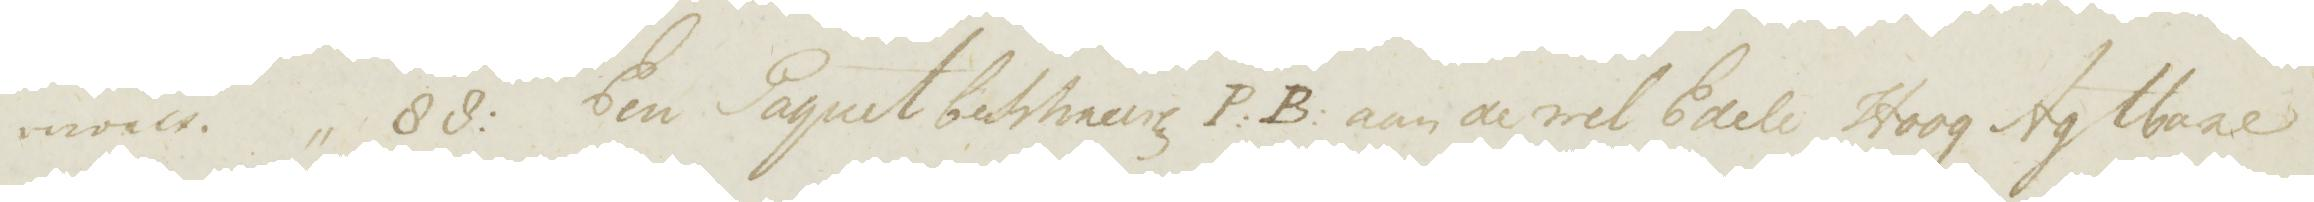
vervalt „ 88: Een Paquet beschreven P: B: aan de wel Edele Hoog Agtbare
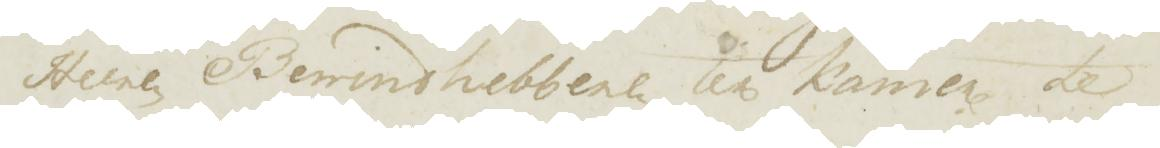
Heeren Bewindhebberen ter Kamer te
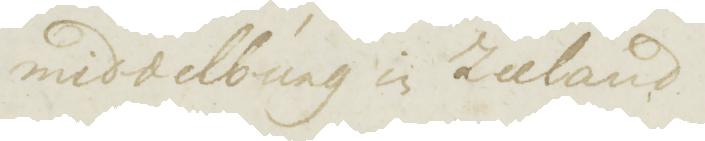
middelburg in Zeeland.
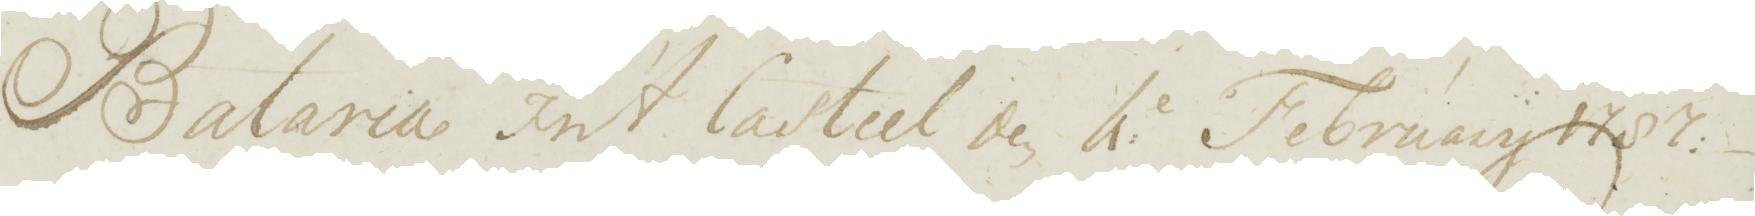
Batavia in’t Casteel den 4:e Februarij 1787:
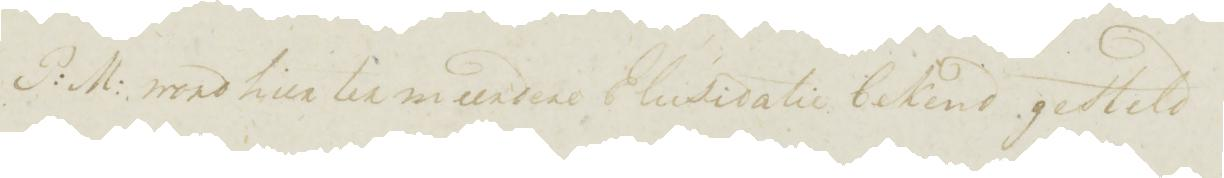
P: M: word hier ter meerdere Elusidatie bekend gesteld
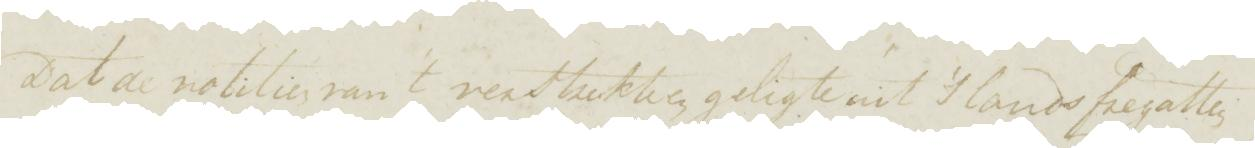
Dat de notities van ’t verstrekten geligte uit 's lands fregatten
